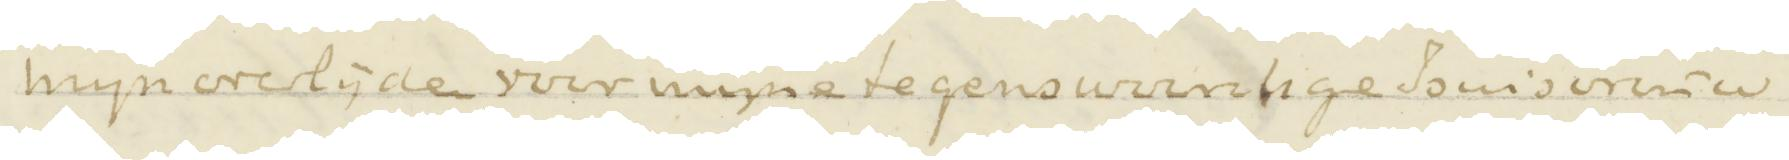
myn ovelijden voor myne tegenswoordige huisvrouw
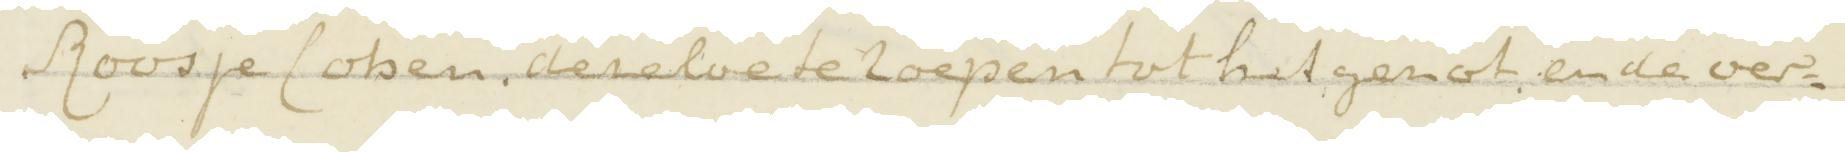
Roosje Cohen, dezelve te roepen tot het genot, en de ver=
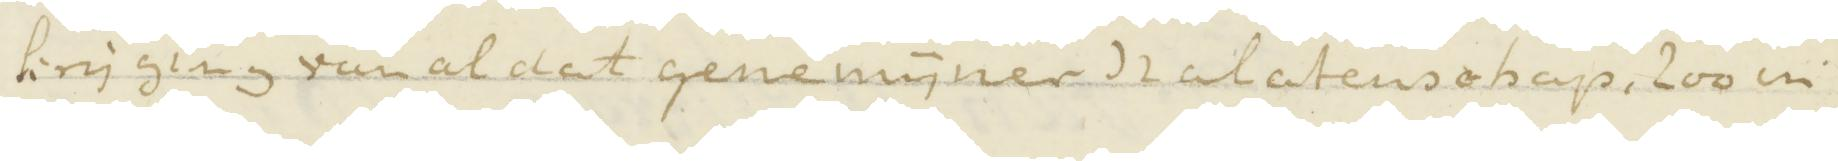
krijging van al dat gene mijner Nalatenschap, zoo in
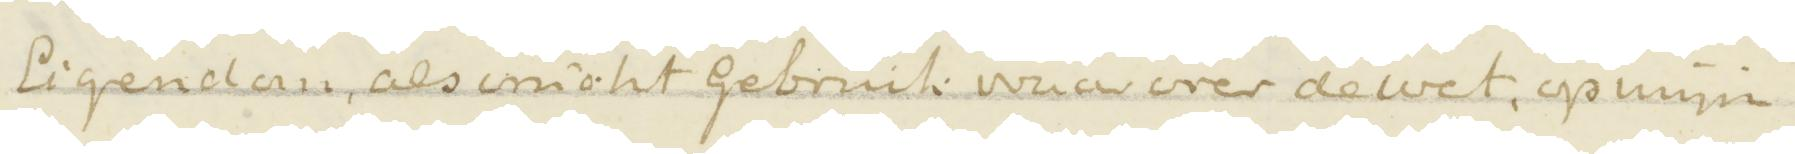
Eigendom, als vrucht Gebruikt waarover de wet, op mijn
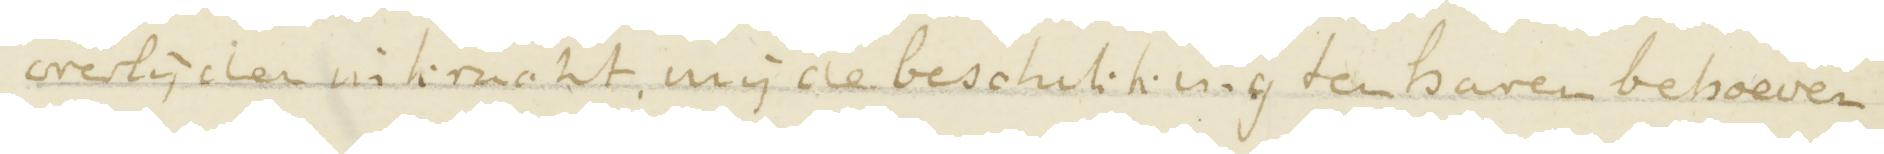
overlijden in kracht, mij de beschikking ten haren behoeven
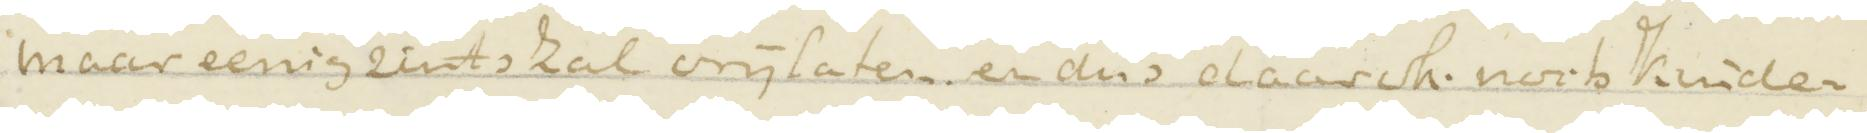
maar eenigzints zal vrijlaten, en dus daar ik noch kinde=
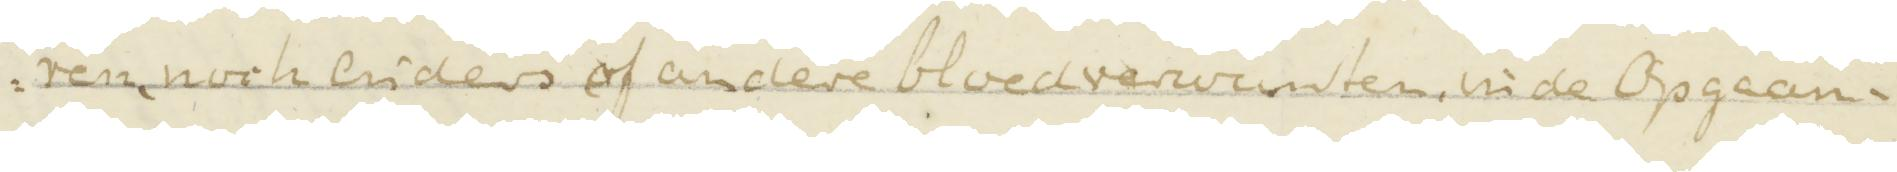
=ren, noch ouders of andere bloedverwanten, in de opgaan-
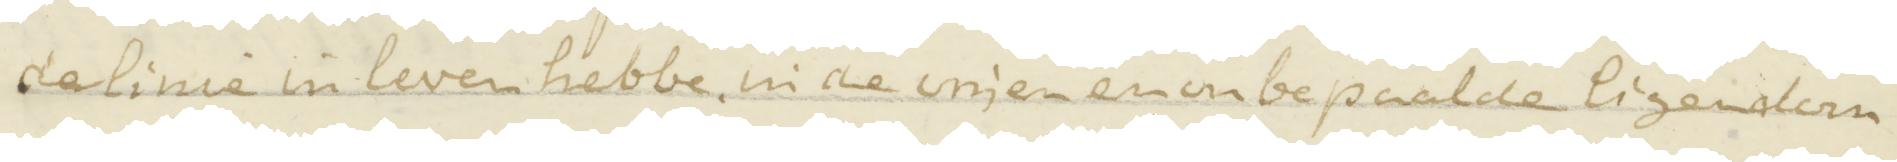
=de linie in leven hebbe, in de vrijen en onbepaalde Eigendom
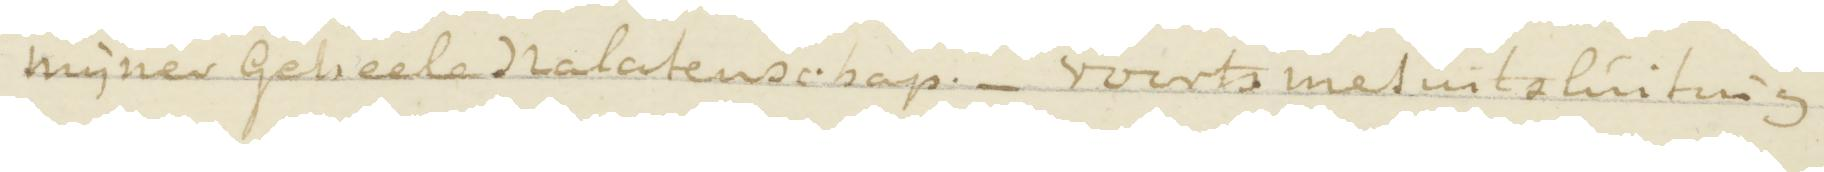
mijner Geheele Nalatenschap. — voorts met uitsluiting
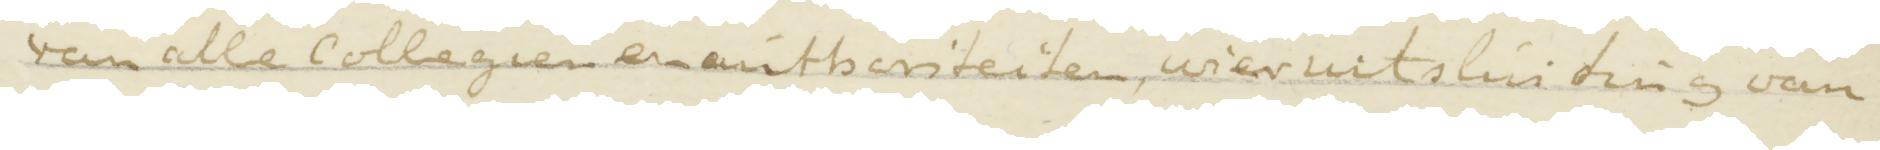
van alle collegien en authoriteiten, wier uitsluiting van
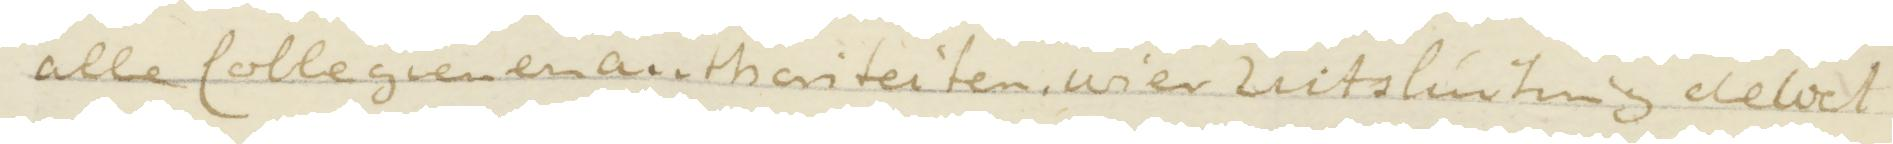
alle Collegien en authoriteiten, wier uitsluiting de wet
